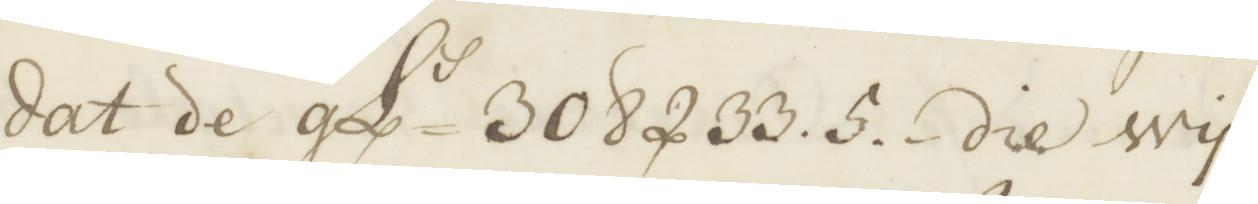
dat de gL=s 308233.5. die wij
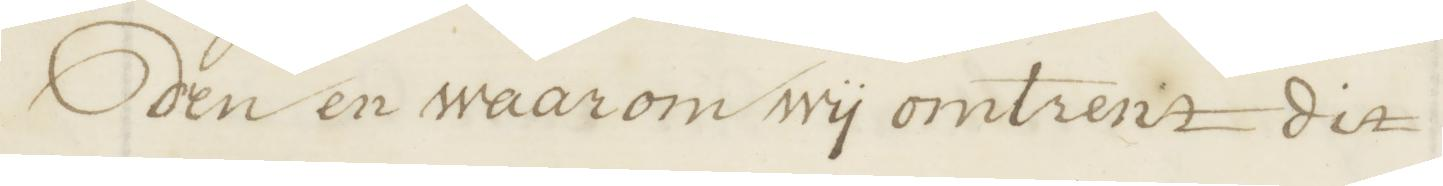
den en waarom wij omtrent dit
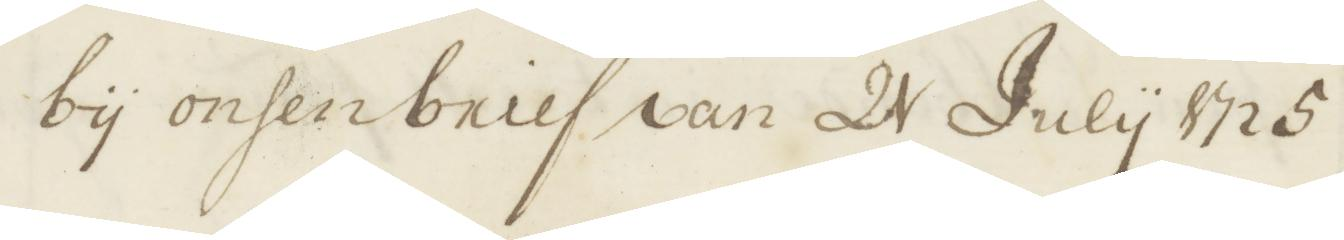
bij onsen brief van 21 Julij 1725
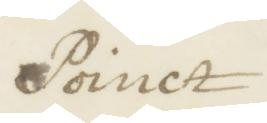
Poinct
